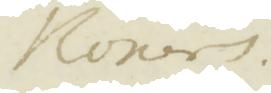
Kopers.
